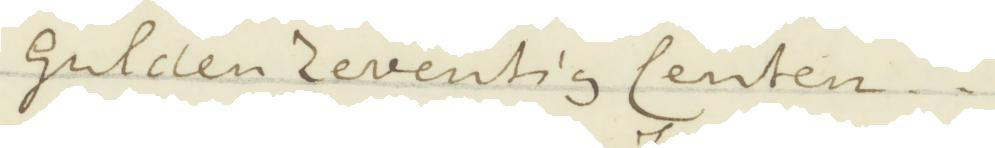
Gulden Zeventig Centen - -
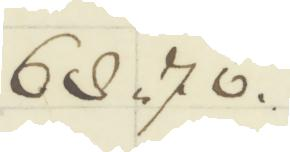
68 „70.
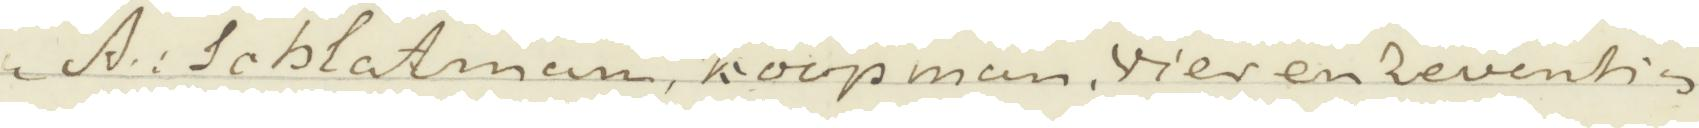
A: Schlatman, koopman, Vier en Zeventig
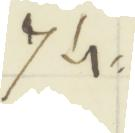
74 „
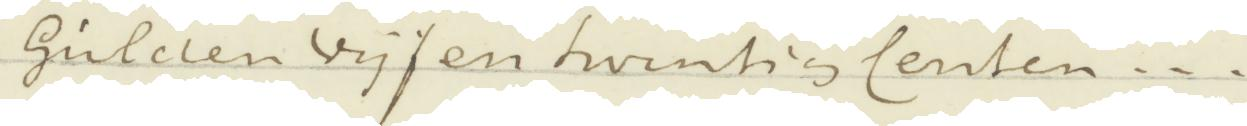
Gulden vijf en twintig Centen - - -
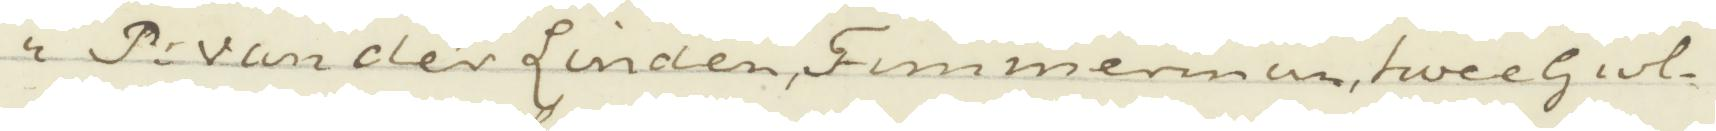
P: van der Linden, Timmerman, twee Gul=
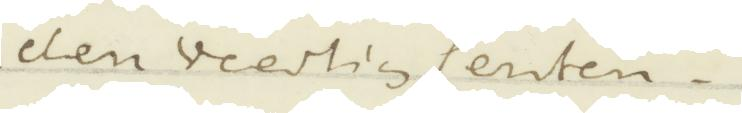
den veertig Centen.
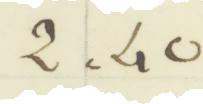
2 „ 40
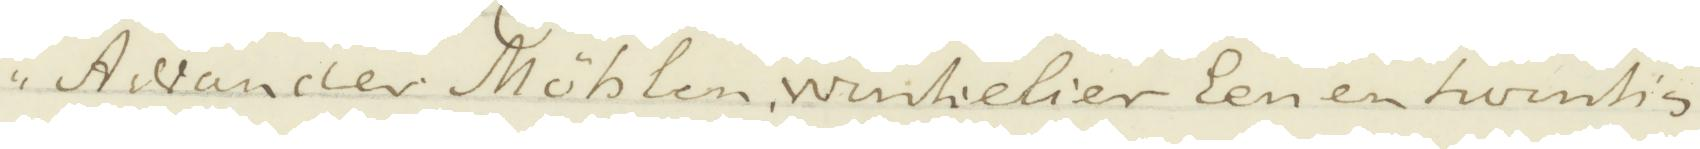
„ A van der Möhlen, winkelier Een en twintig
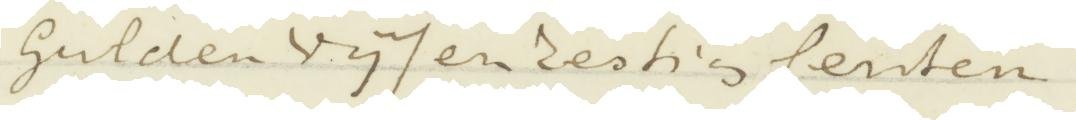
Gulden Vijf en Zestig Centen-
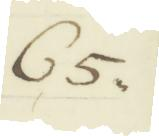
65 „
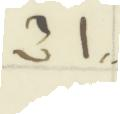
31,
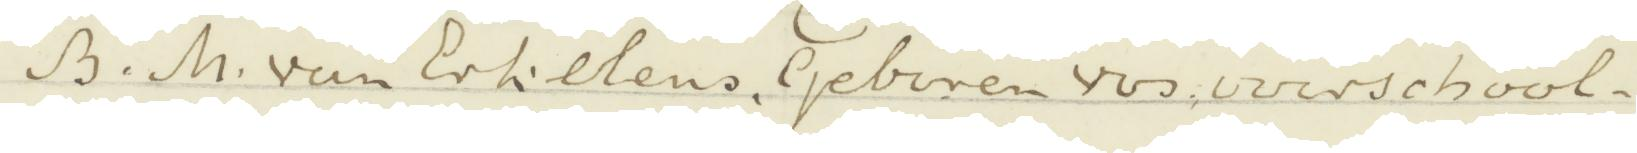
B. M. van Erkelens, Geboren Vos, voor school-
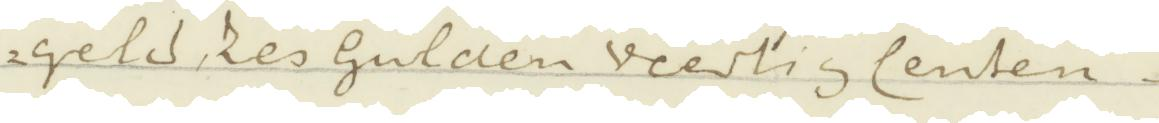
=geld, Zes Gulden veertig Centen -
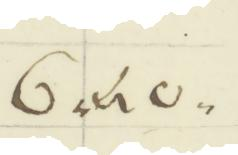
6 „ 40 „
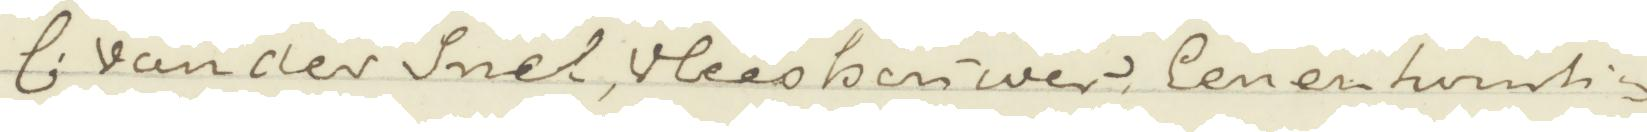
C: van der Snel, Vleeshouwer, Een en twintig
